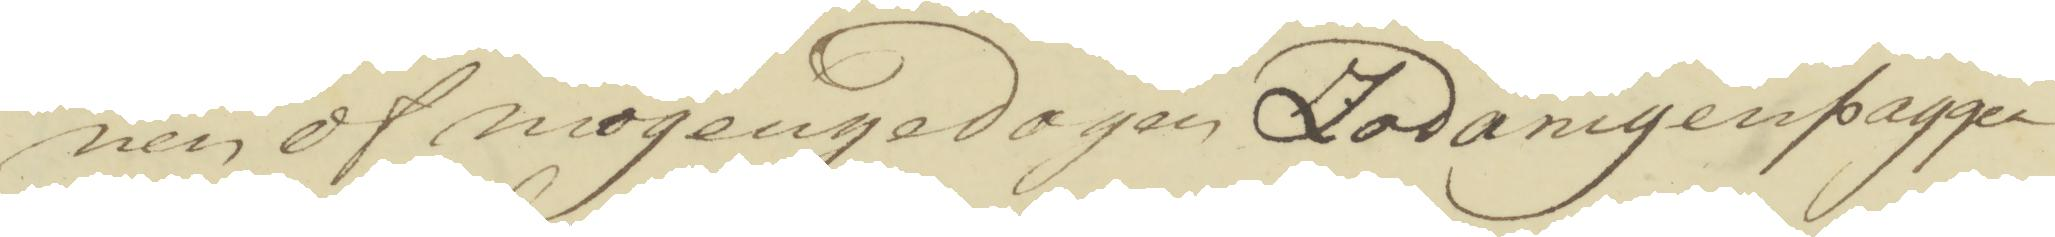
nen of mogen gedogen zodanigen pagger
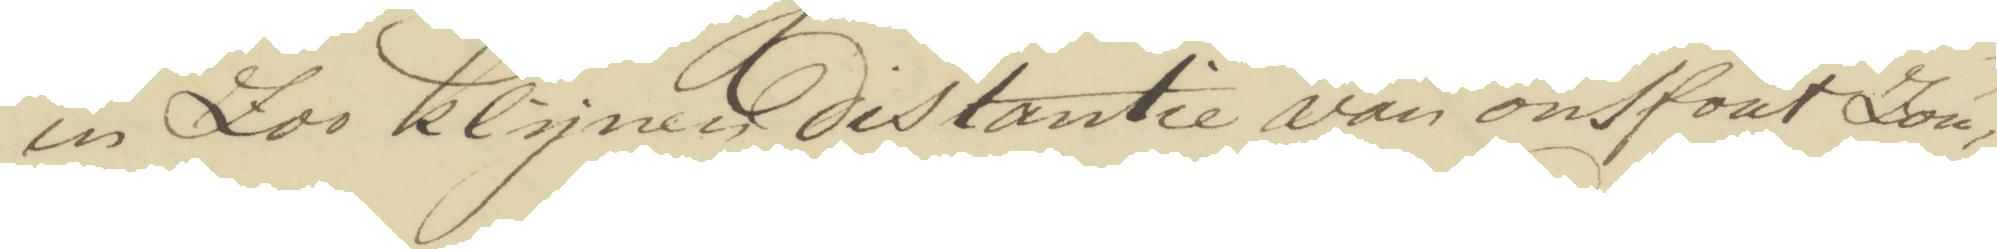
in zoo klijnen distantie van ons fort zou„
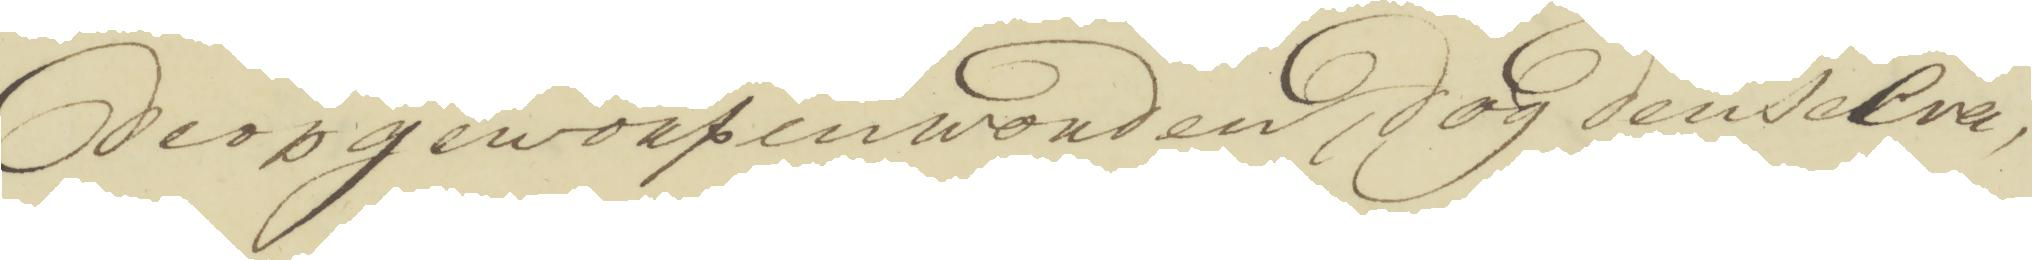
de op geworpen worden, dog denselven,
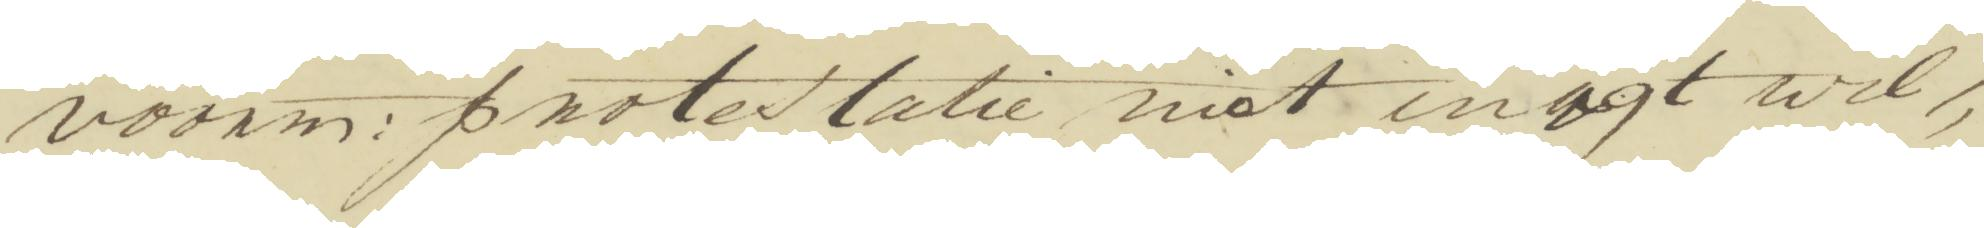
voorm: protestatie niet in agt wil„
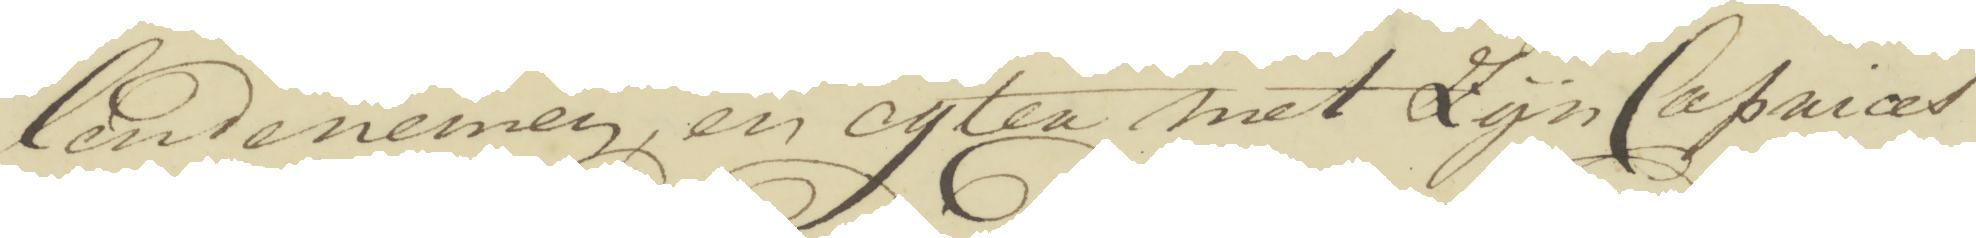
lende nemen, en egter met zijn Caprices
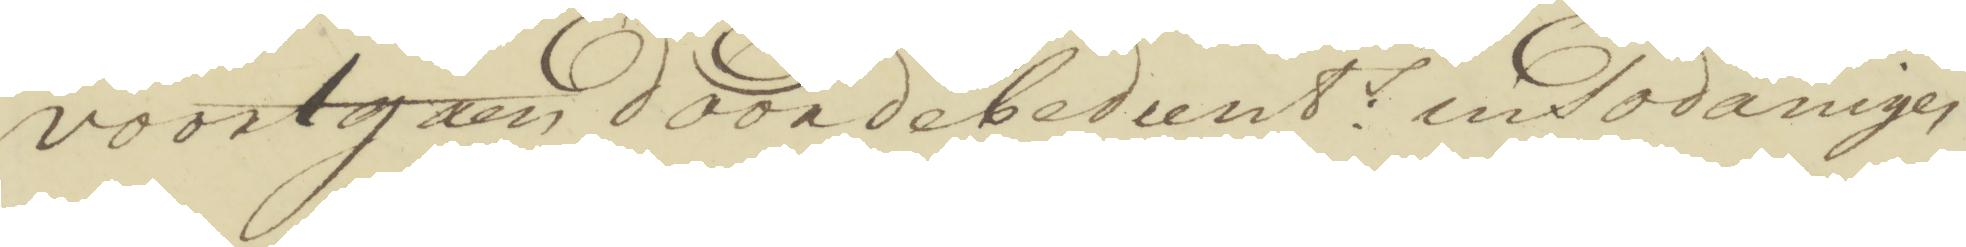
voortgaen door de bedient:s in sodanigen
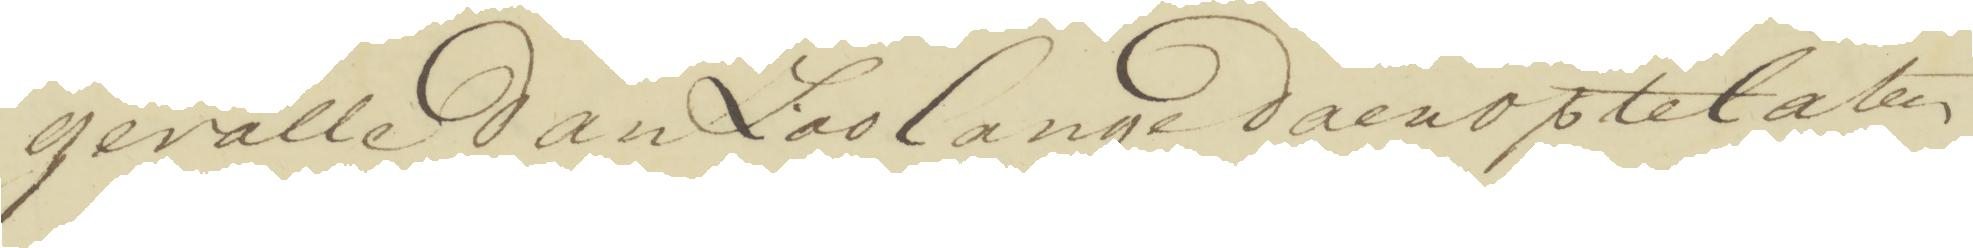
gevalle dan zoo lange daer op te laten
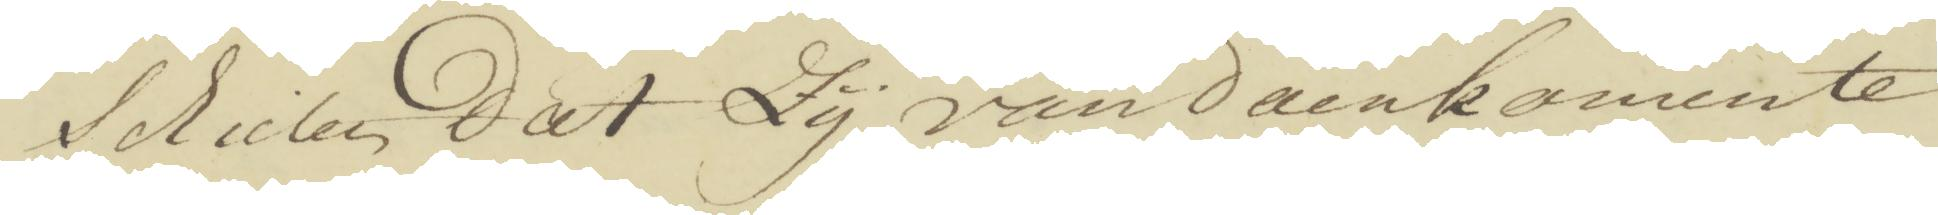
schieten dat zij van daerkomen te
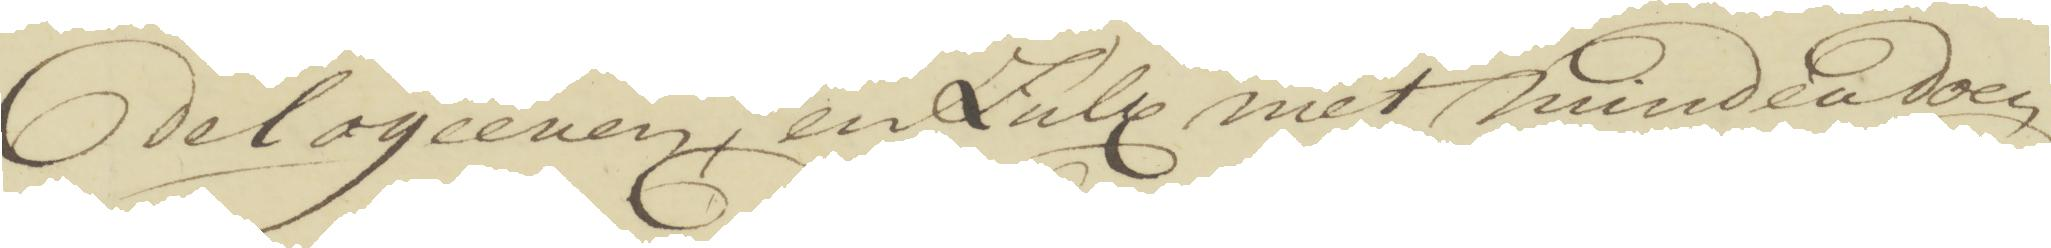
delogeeren, en zulx niet minder doen
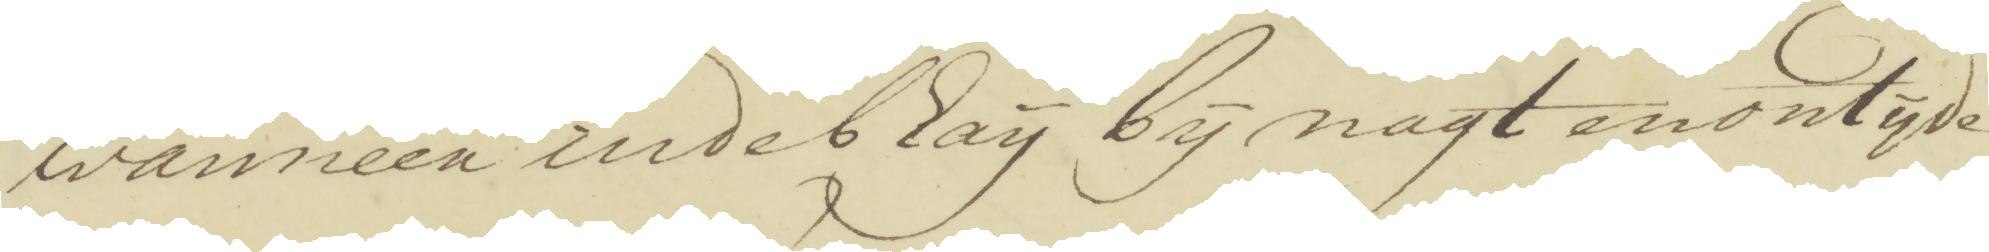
wanneer inde bhaij bij nagt en ontijde
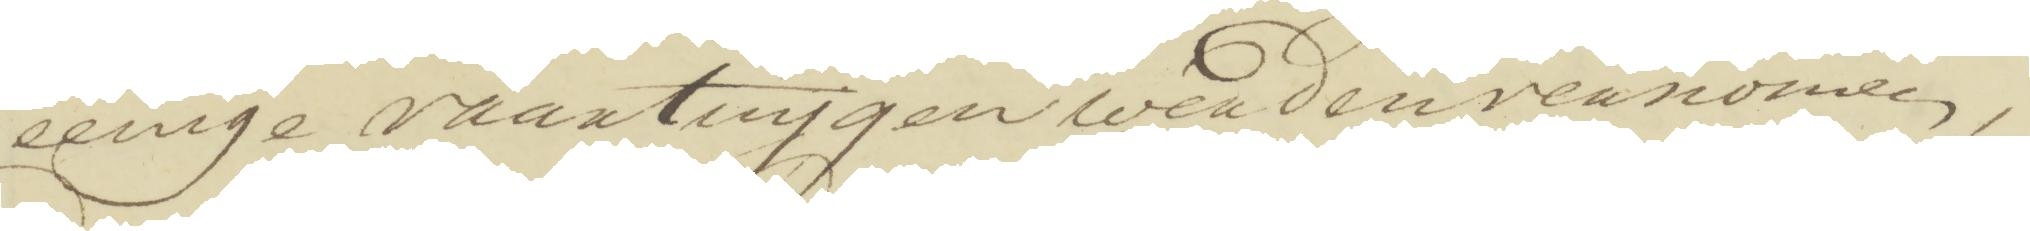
eenige vaartuijgen werden vernomen,
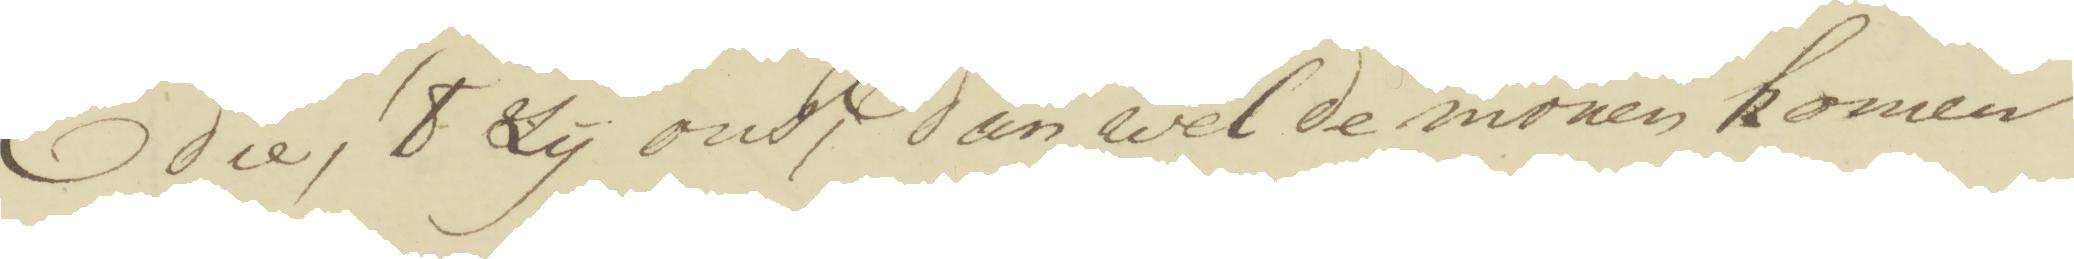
die, 't zij ons, dan wel de moren komen
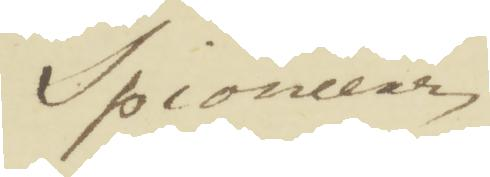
spioneeren
